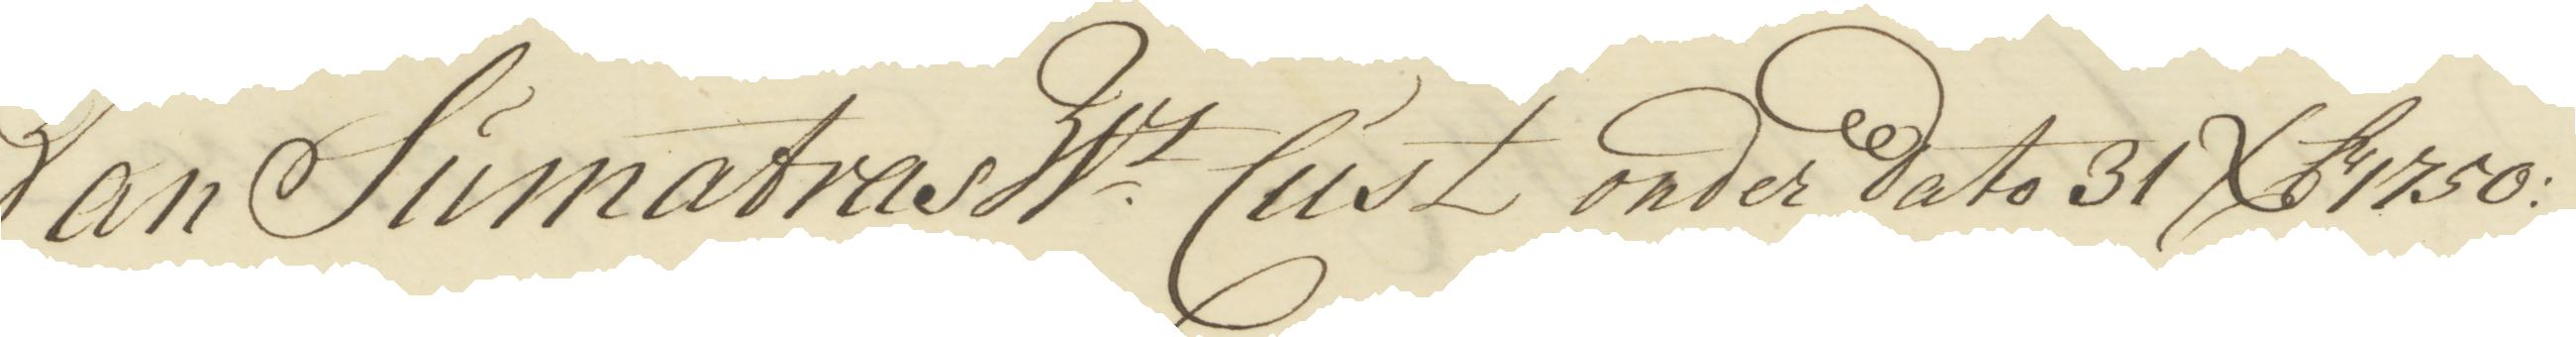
Van Sumatras W:t Cust onder dato 31 Xbr 1750:
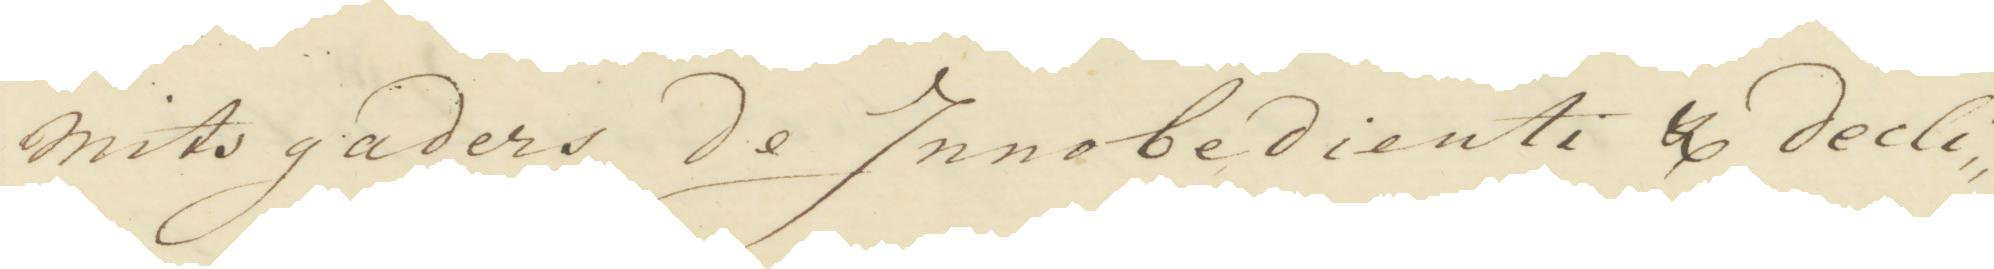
mitsgaders de Jnnobedienti & decli„
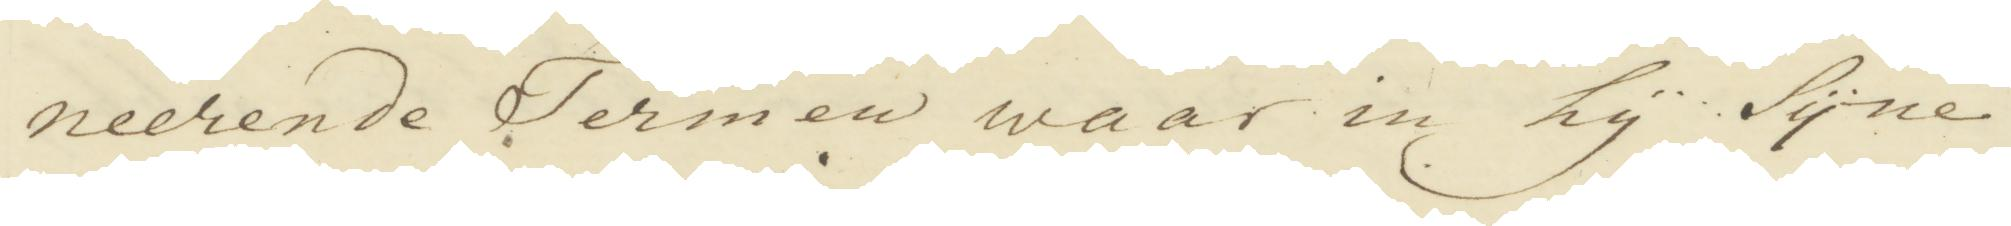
neerende Termen waar in hij sijne
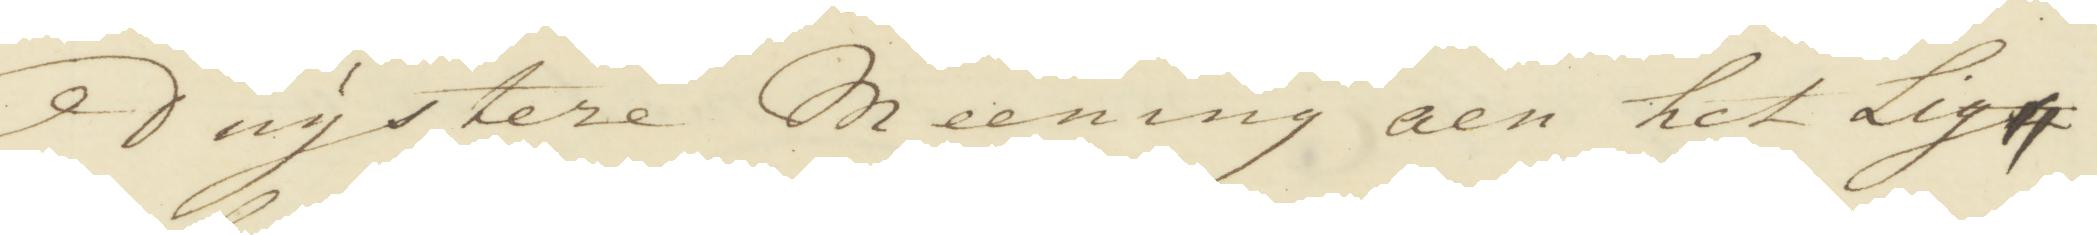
duijstere meening aen het Lig„
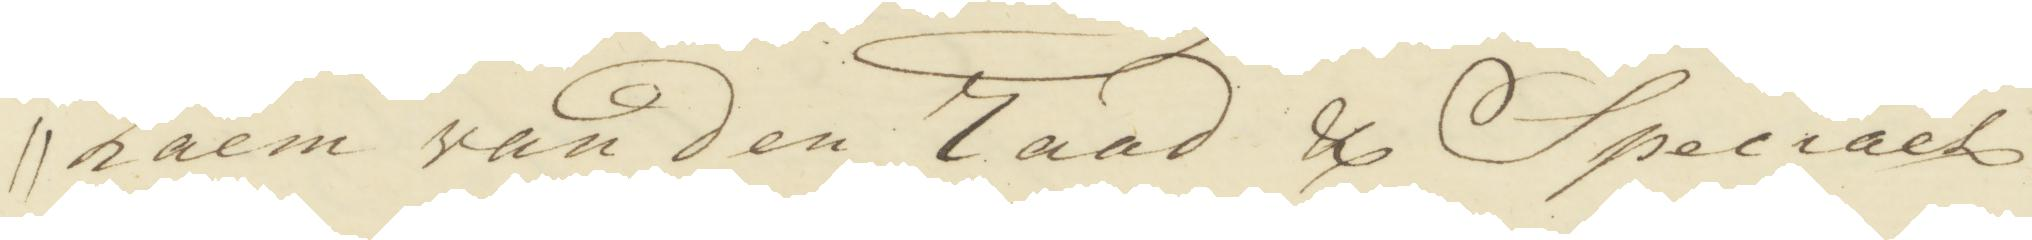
„haem van den raad & speciael
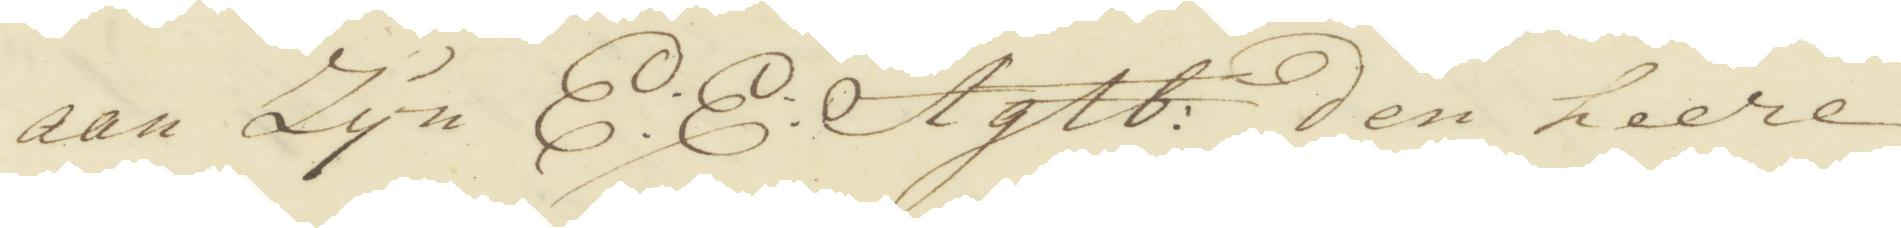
aan Zijn E: E: Agtb: den heere
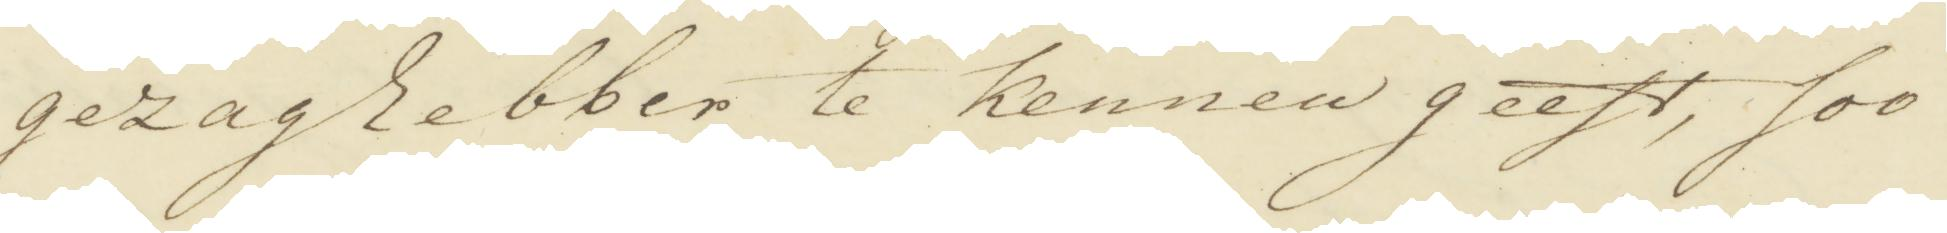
gezaghebber te kennen geeft, soo
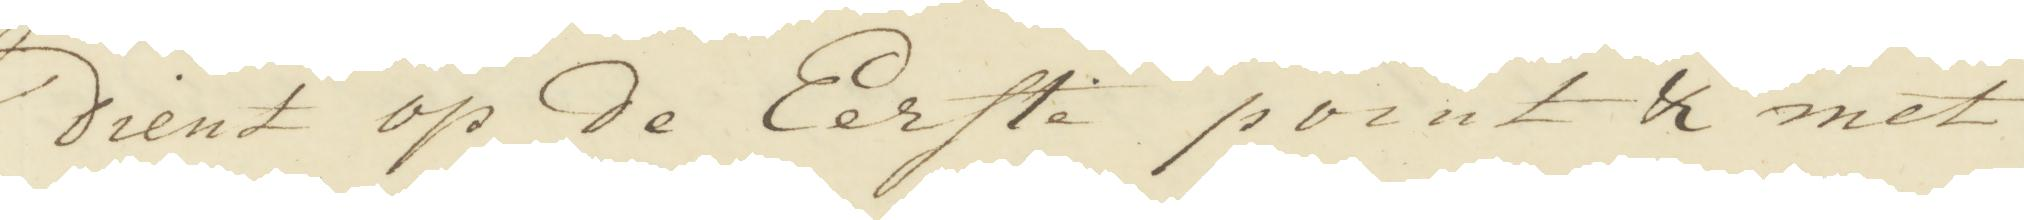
dient op de Eerste point & met
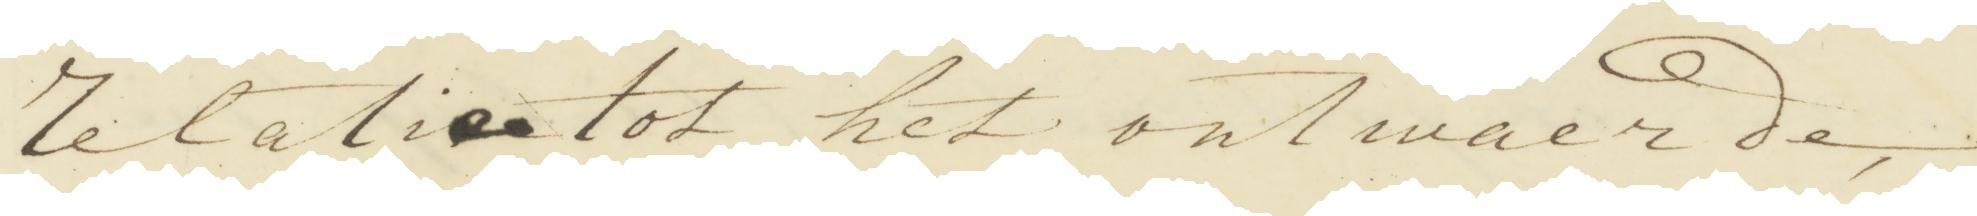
relatie tot het ontwaerde,
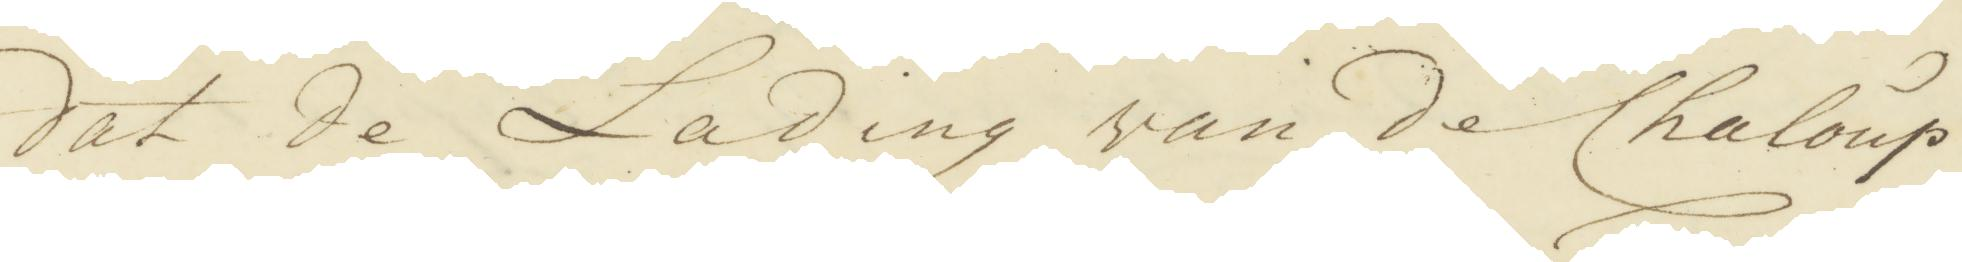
dat de lading van de Chaloup
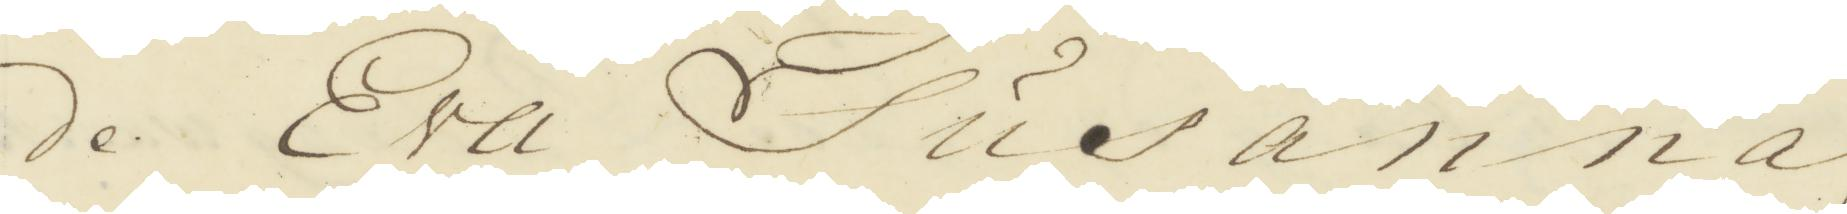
de Eva Susanna
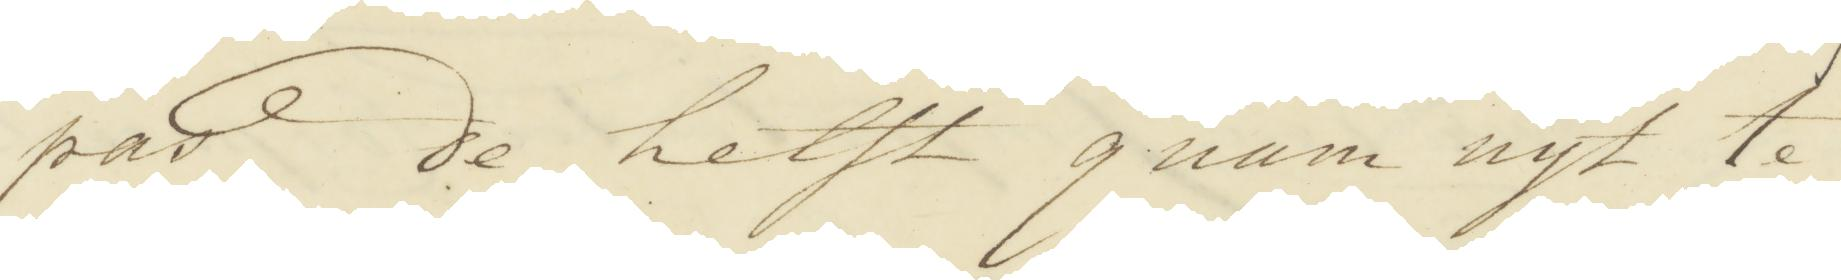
pas de helft quam uijt te
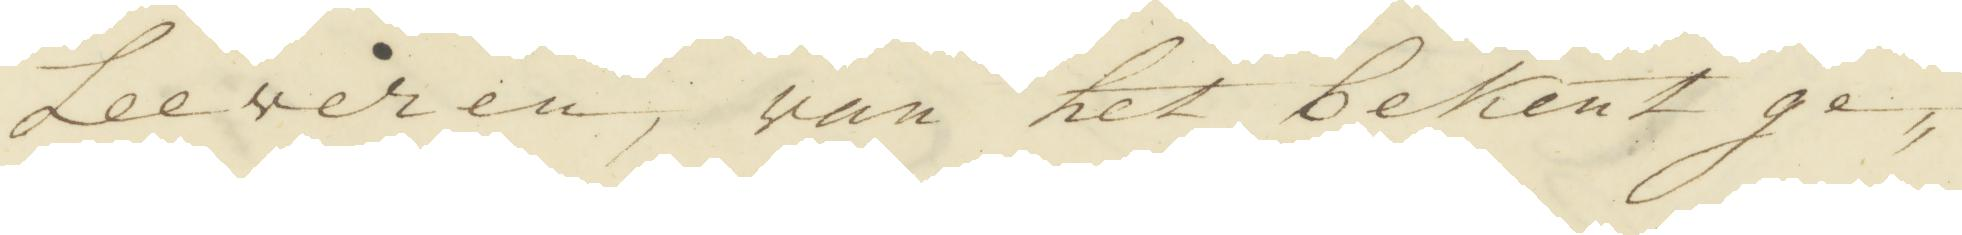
leeveren, van het bekent ge„
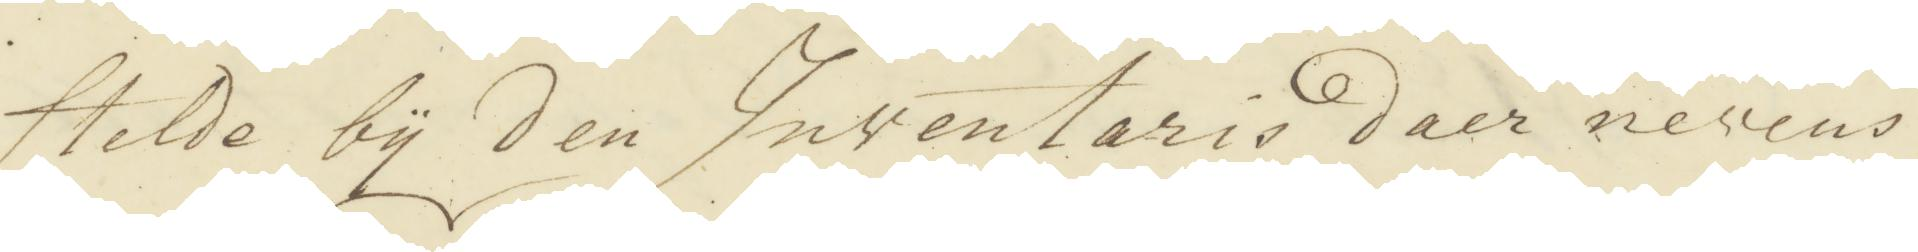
stelde bij den Jnventaris daer nevens
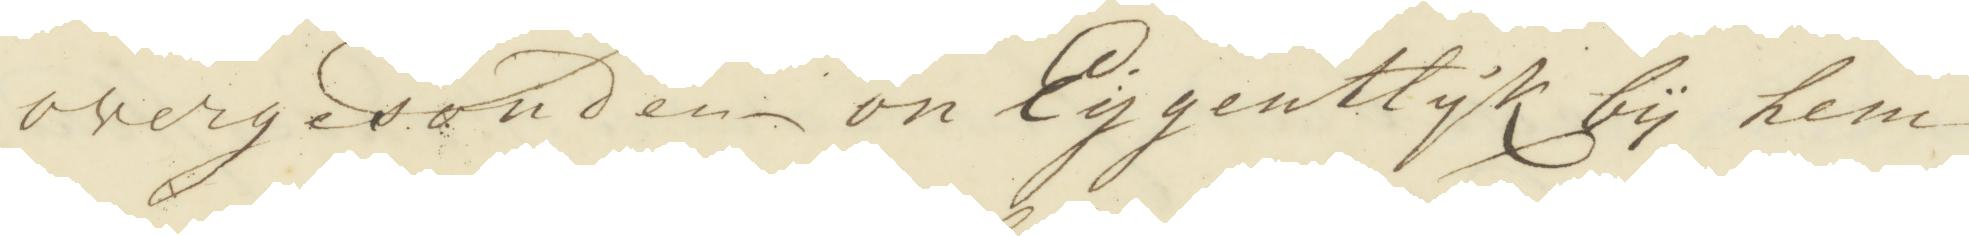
overgesonden on Eijgentlijk bij hem
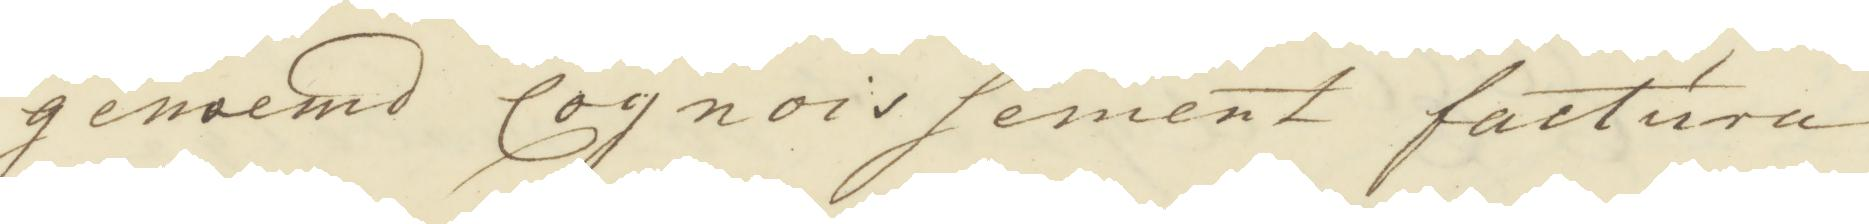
genoemd cognoissement factura
